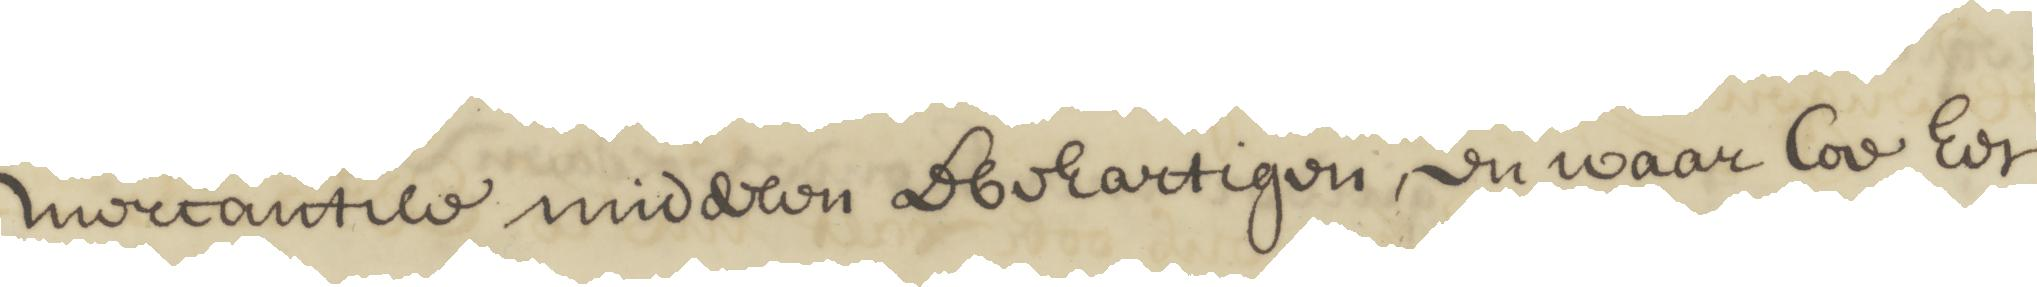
mercantile middelen tebehartigen, en waar toe het
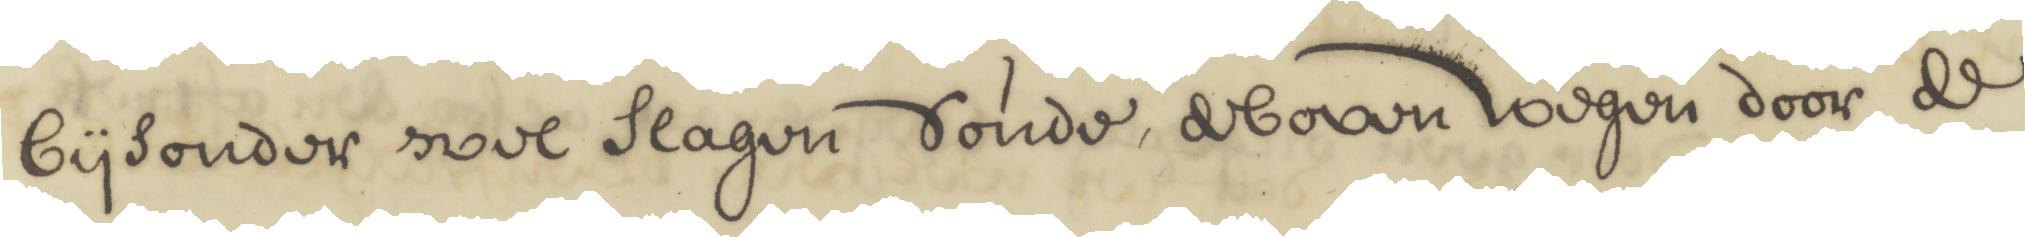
bij sonder wel slagen soude, deboven wegen door de
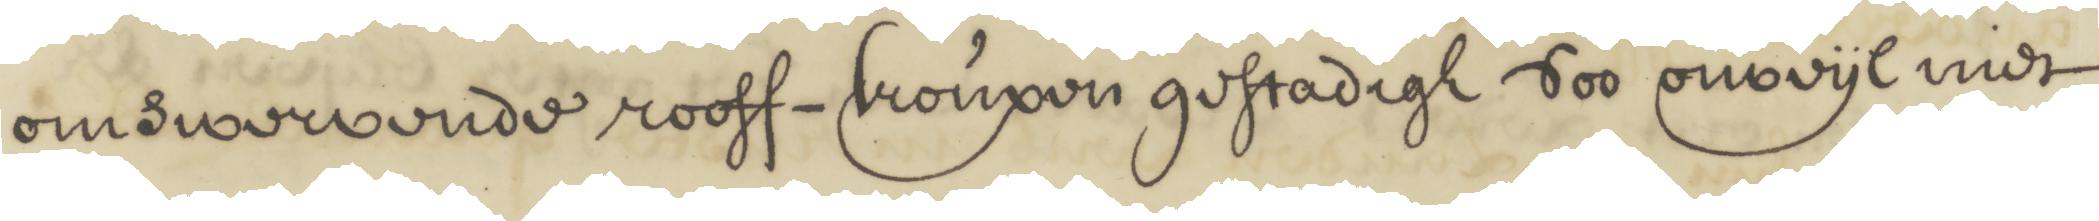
omswervende rooff-troupen gestadigh soo onveijl niet
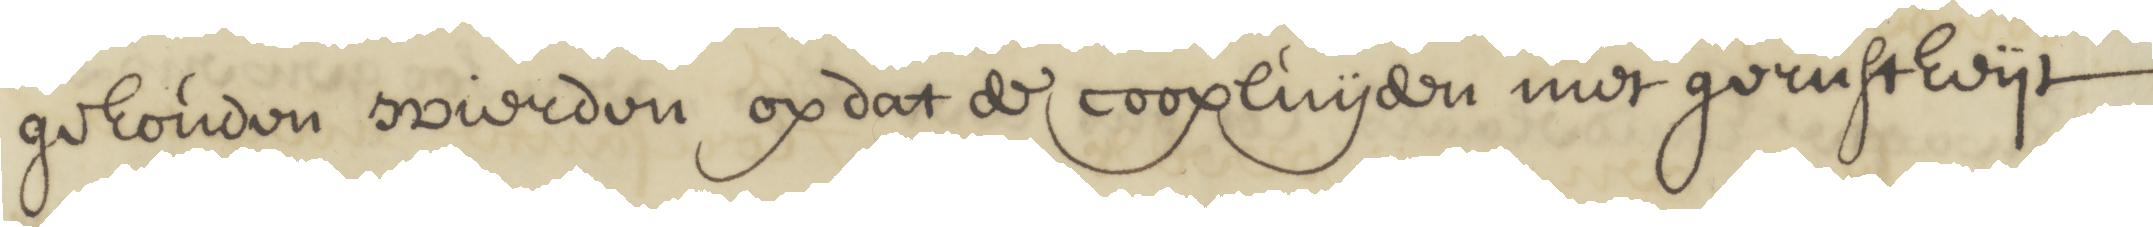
gehouden wierden op dat de coopluijden met gerustheijt
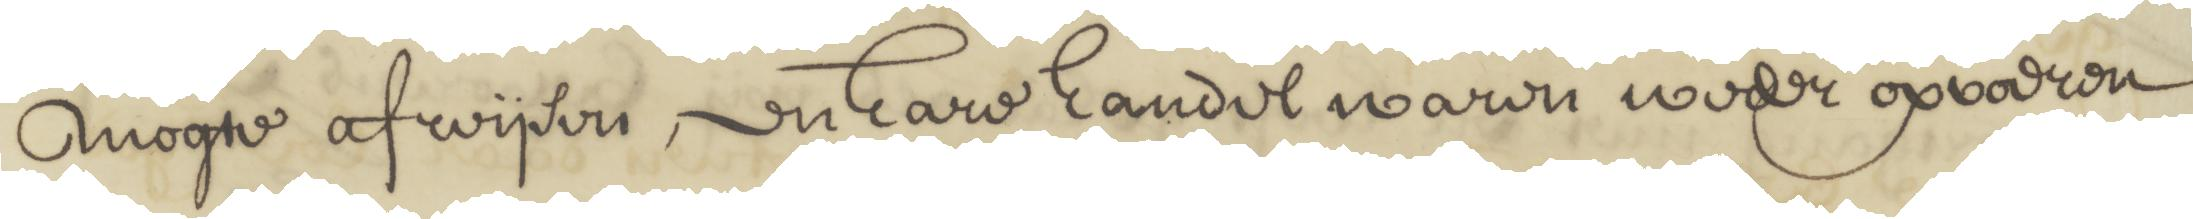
mogte afreijsen, en hare handel waren weder op voeren
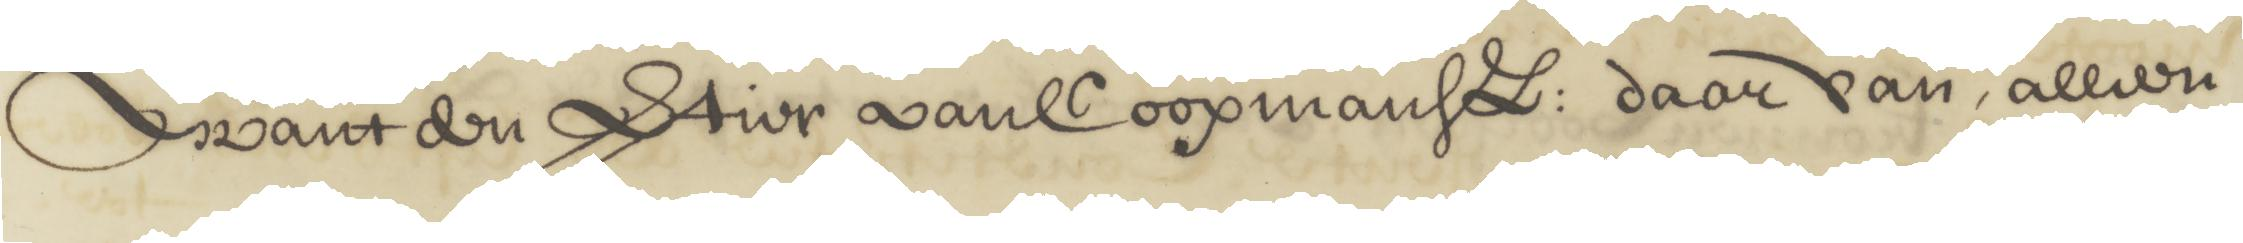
want den vertier van Coopmansz: daar van, alleen
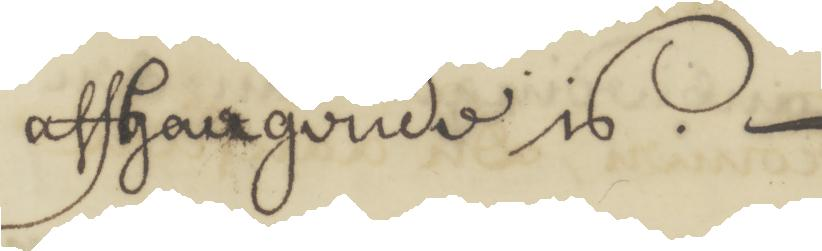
affhangende is. —
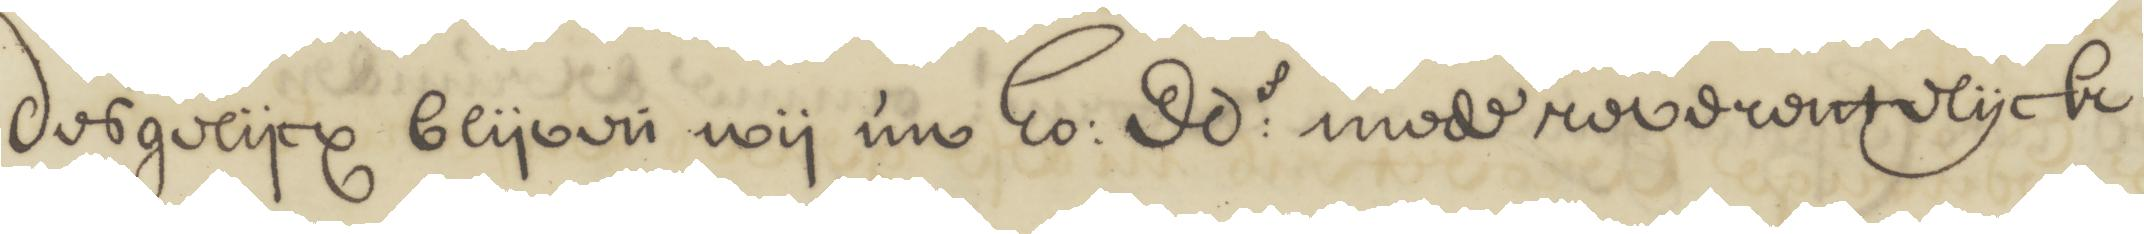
des gelijcx blijven wij uw ho: Ed:s mede reverentelijck
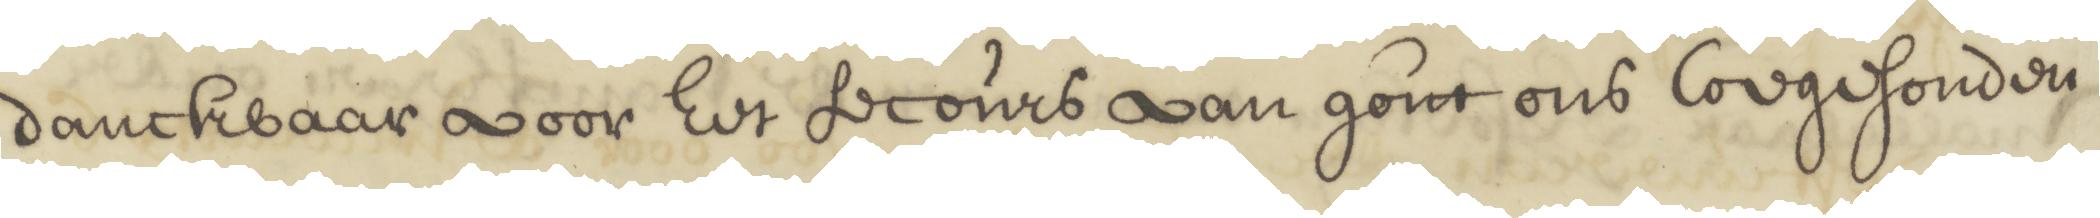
danckbaar voor het secours van gout ons toegesonden
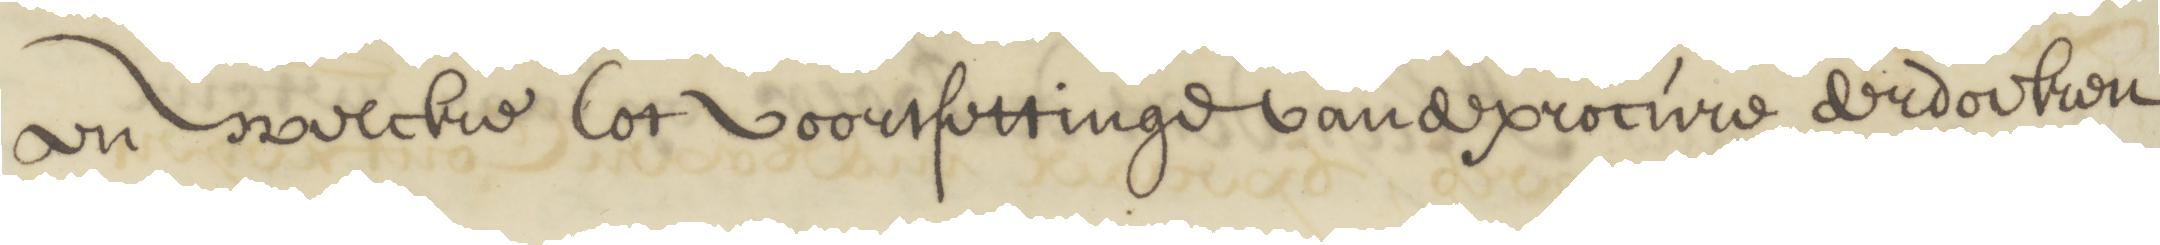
en welcke tot voortsettinge van de procure derdoeken
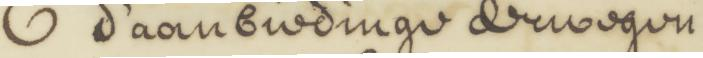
d’aanbiedinge derwegen
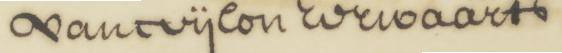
van ceijlon herwaarts
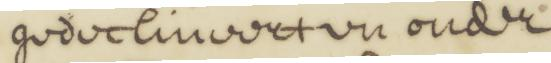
gedeclineerten onder
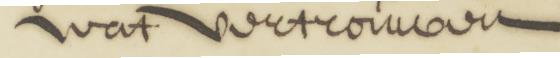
wat vertrouwen
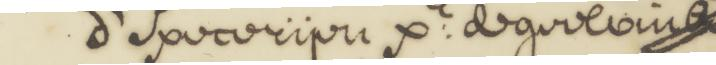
d’ specerijen p:r de geelvink
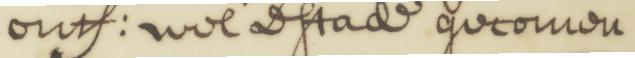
ontf: wel testade gecomen
